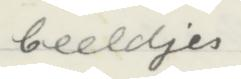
beeldjes
